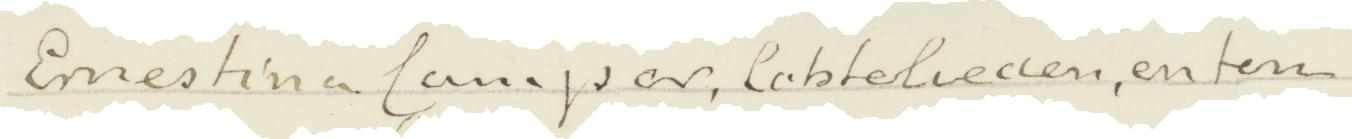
Ernestina Camper, Echtelieden, en ten
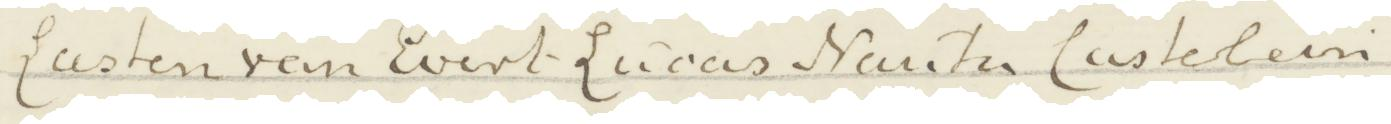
Lasten van Evert Lucas Nauta Castelein
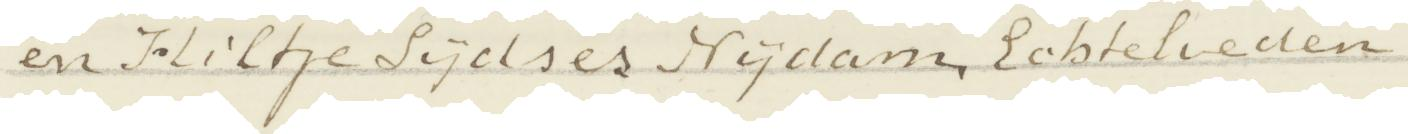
en Hiltje Sijdses Nijdam, Echtelieden
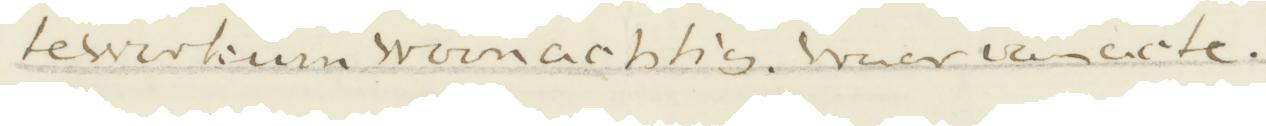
te workum woonachtig. Waar van acte.
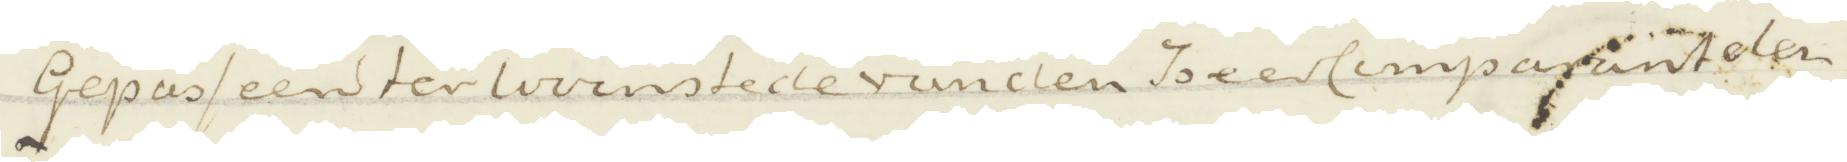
Gepasseerd ter woonstede van den Heer Comparant den
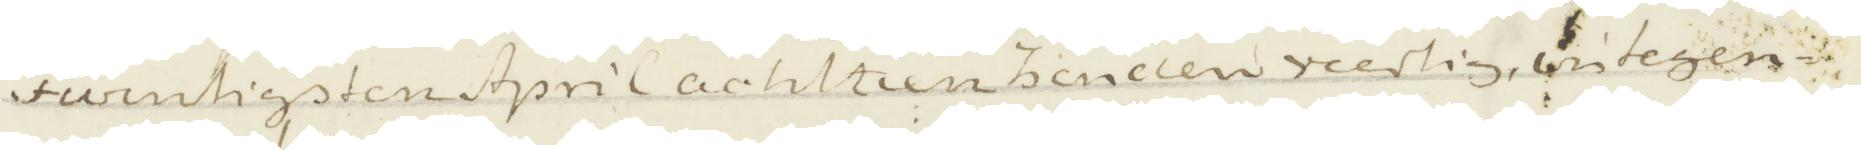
Twintgsten April achttien honderd veertig, in tegen-
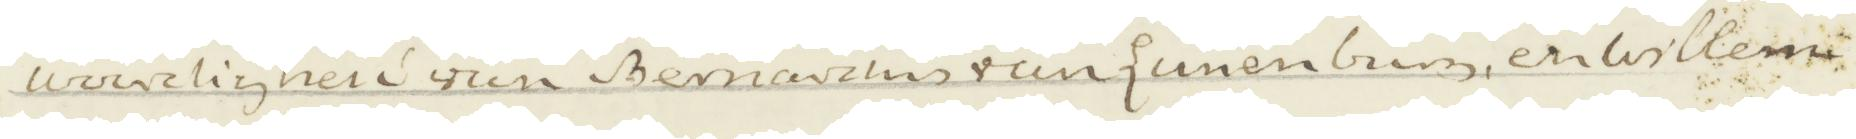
woordigheid van Bernardus van Lunenburg, en Willem
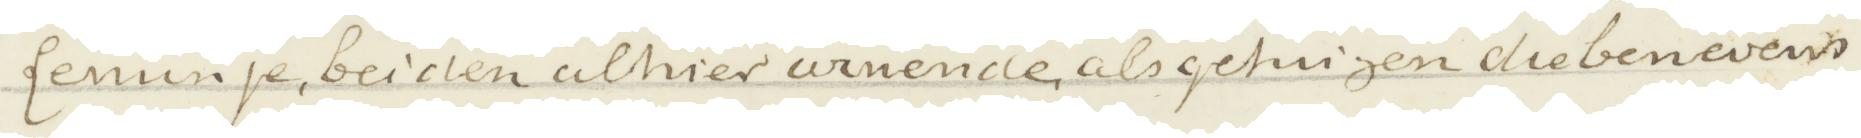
Leminje, beiden alhier wonende als getuigen die benevens
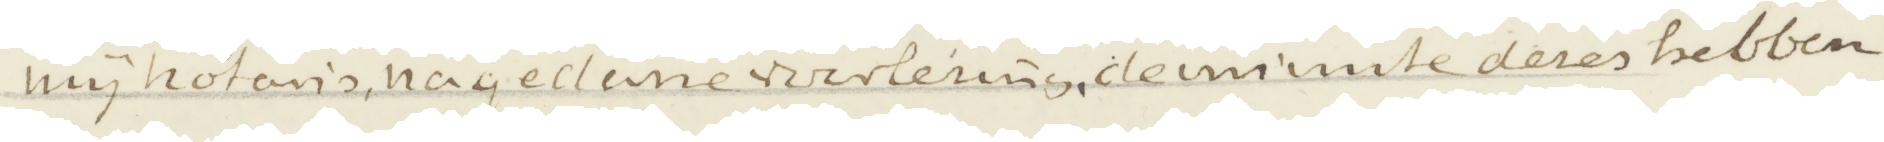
mij notaris, nagedane voorlezing de minute dezes hebben
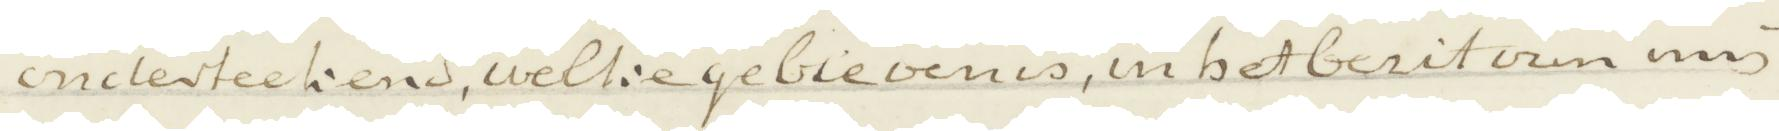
onderteekend, welke gebleven is, in het bezit van mij
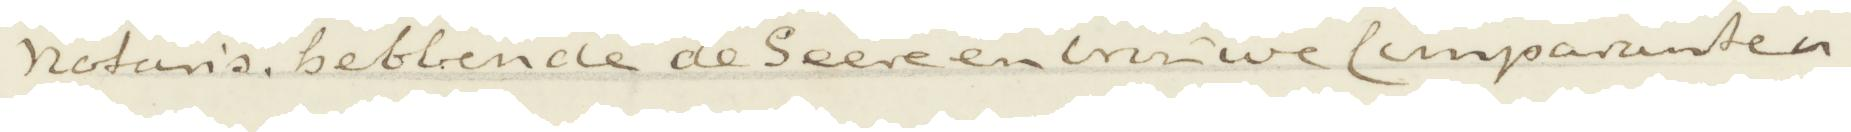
Notaris, hebbende de heere en vrouwe Comparanten
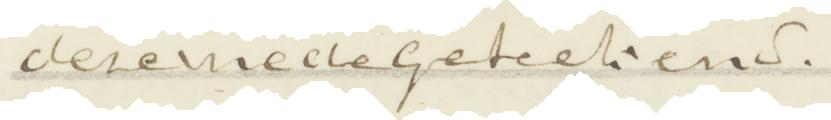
deze mede geteekend.
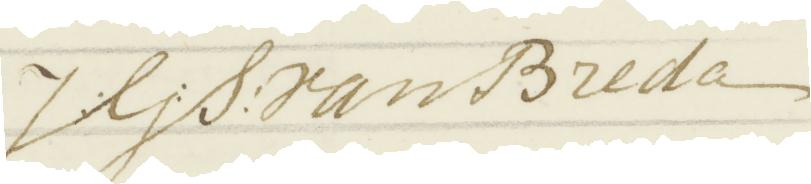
H: G: S: van Breda
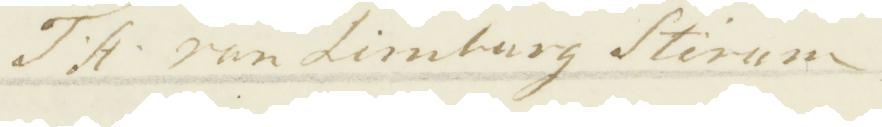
T: H: van Limburg Stirum
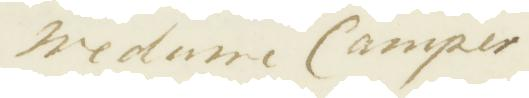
weduwe Camper
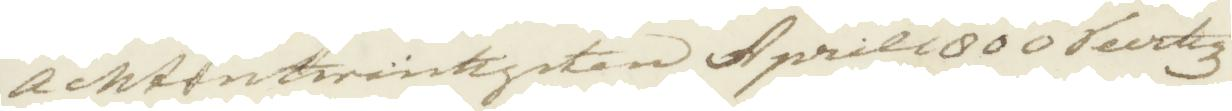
achten twintigsten April 1800 Veertig
